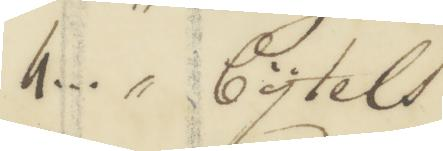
4.-. „ bijtels
